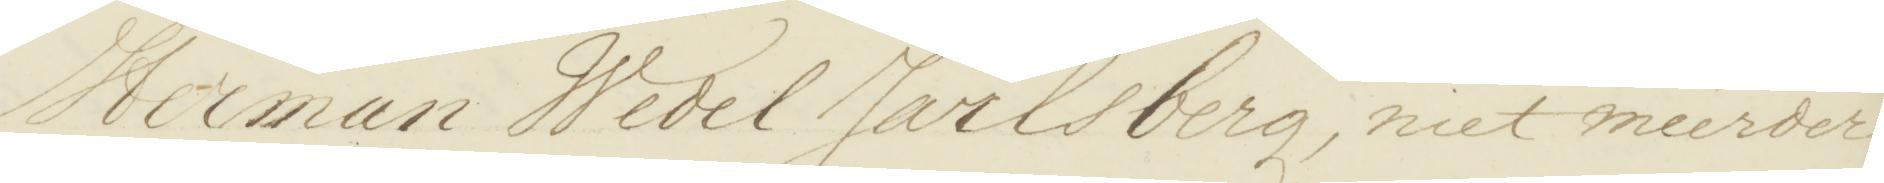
Herman Wedel Jarlsberg, niet meerder
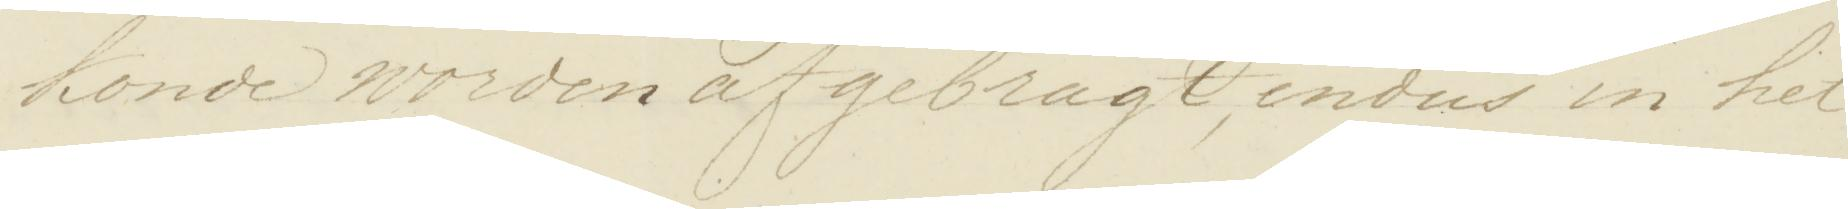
konde worden afgebragt, en dus in het
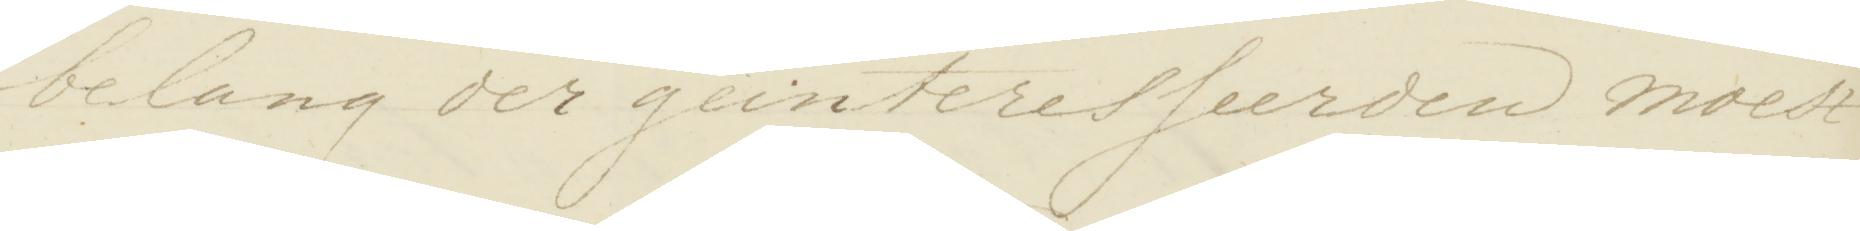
belang der geinteresseerden moest
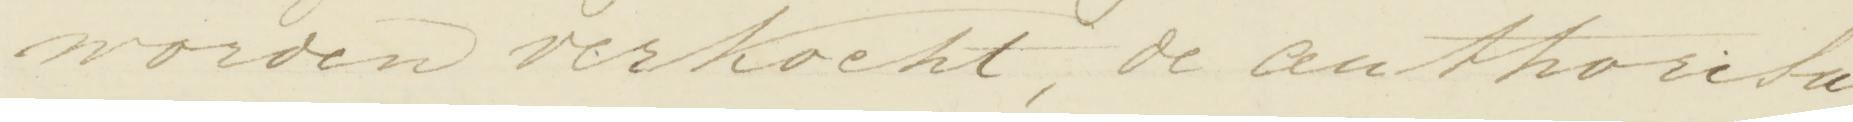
worden verkocht, de authorisa
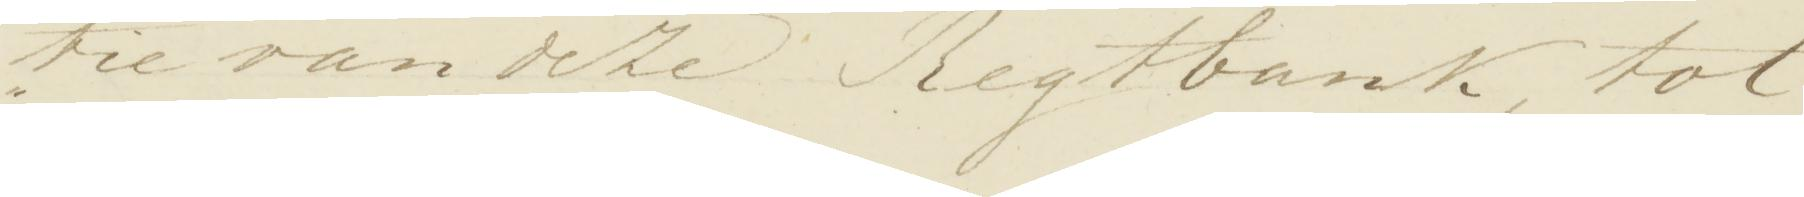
„tie van deze Regtbank, tot
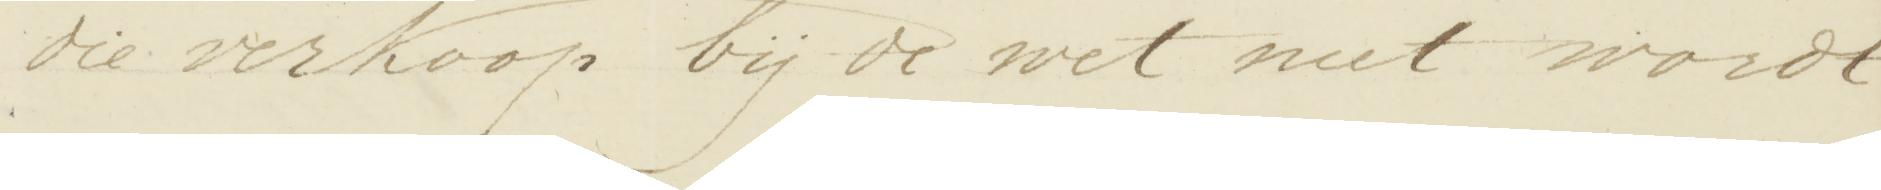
die verkoop bij de wet niet wordt
